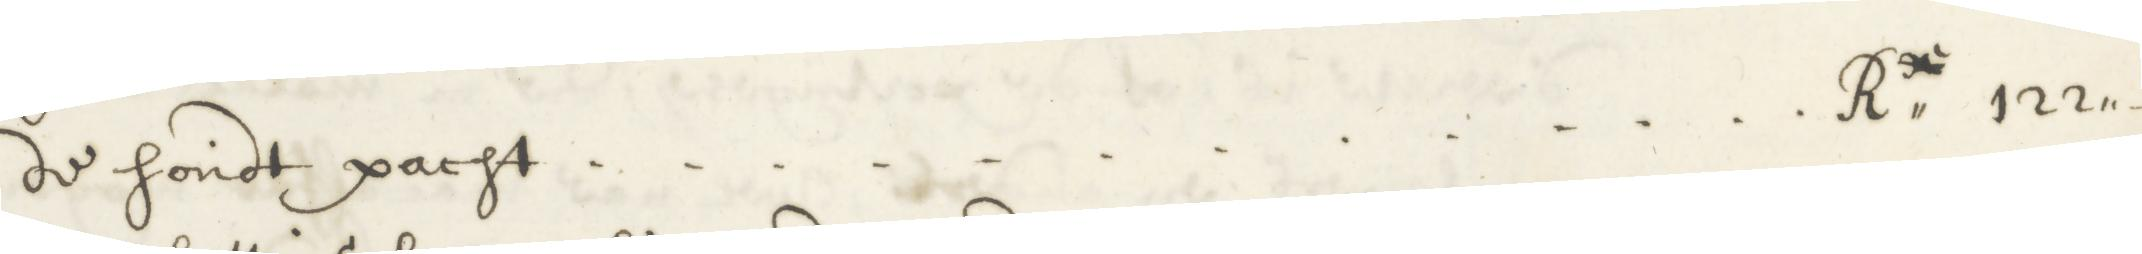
de houdt pacht - - - - - - - - - - - - - R„x 122„
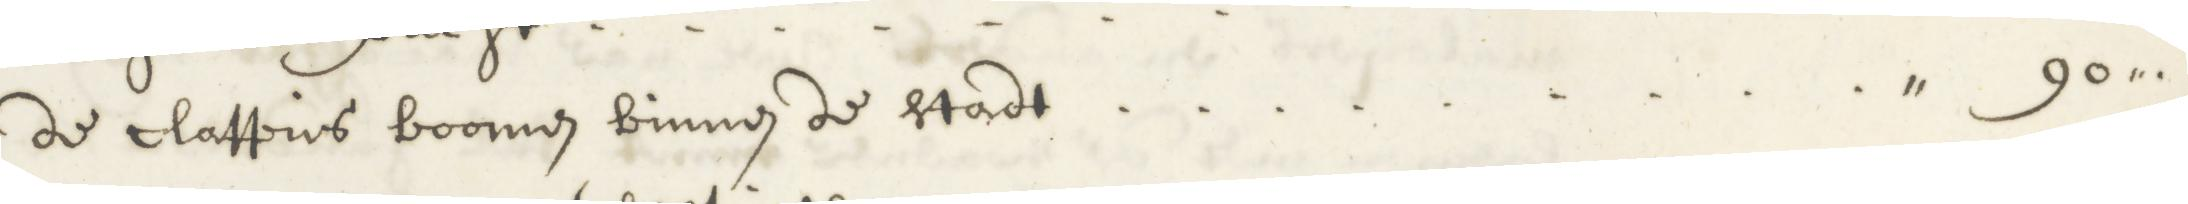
de clappus boomen binnen de stadt - - - - - - - - - „ 90„.
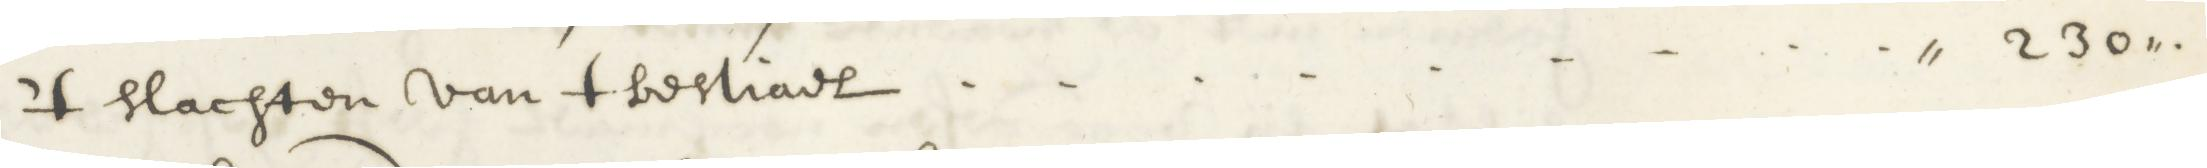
’t slachten van t bestiael - - - - - - - - - „ 230„.
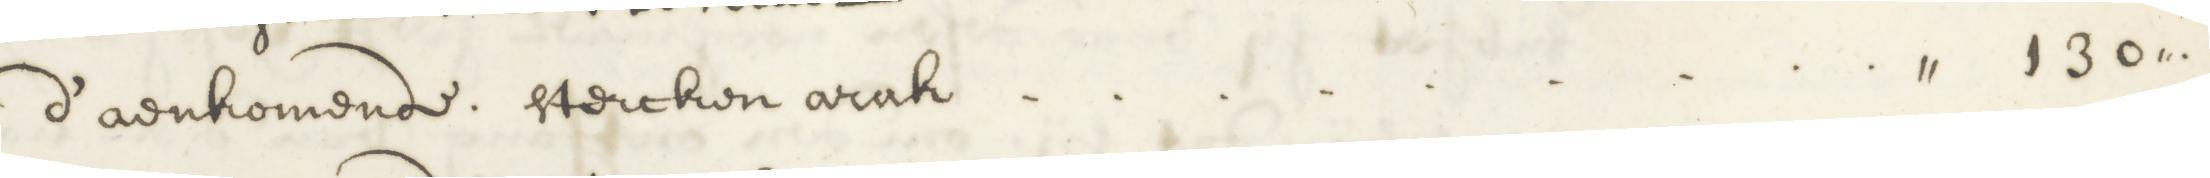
d’aenkomende. stercken arak - - - - - - - - „ 130„.
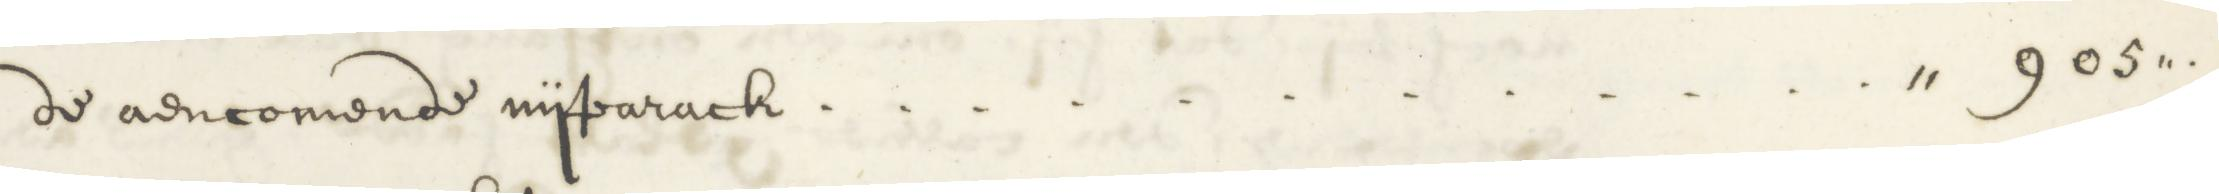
de aencomende nijparack - - - - - - - - - - - - „ 905„.
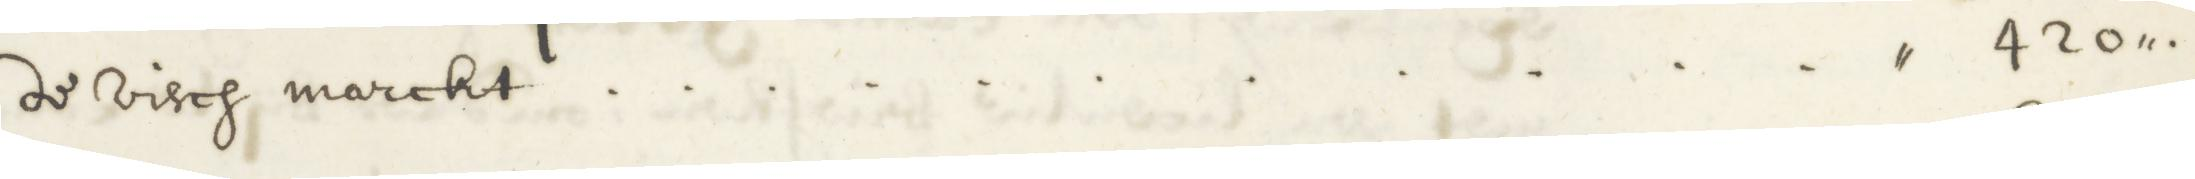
de visch marckt - - - - - - - - - - - - „ 420„.
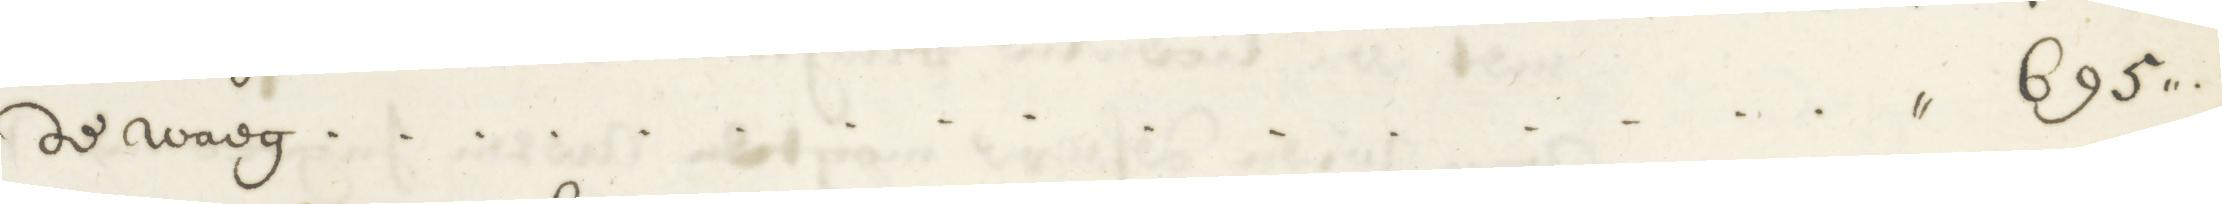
de waeg - - - - - - - - - - - - - - - - „ 695„.
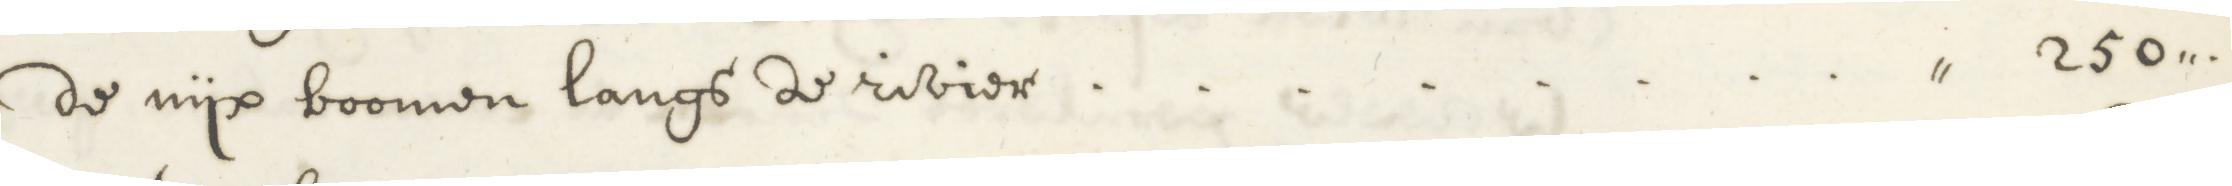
de nijp boomen langs de rivier - - - - - - - - „ 250„.
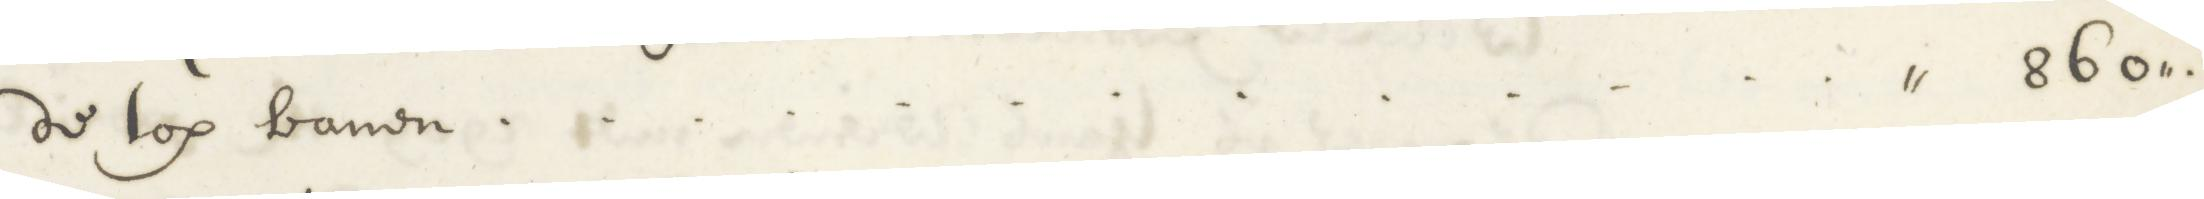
de top banen - - - - - - - - - - - - - „ 860„.
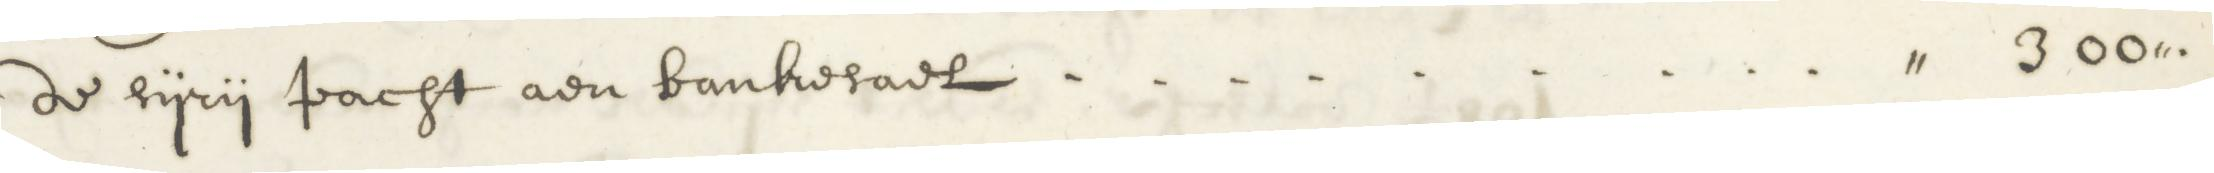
de sijrij pacht aen bankesael - - - - - - - - - „ 300„.
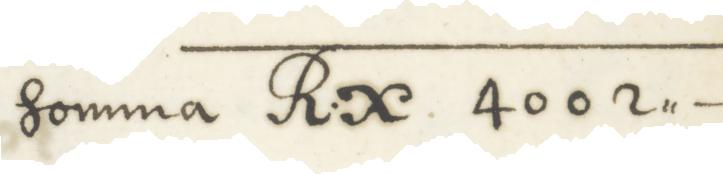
somma Rx 4002„
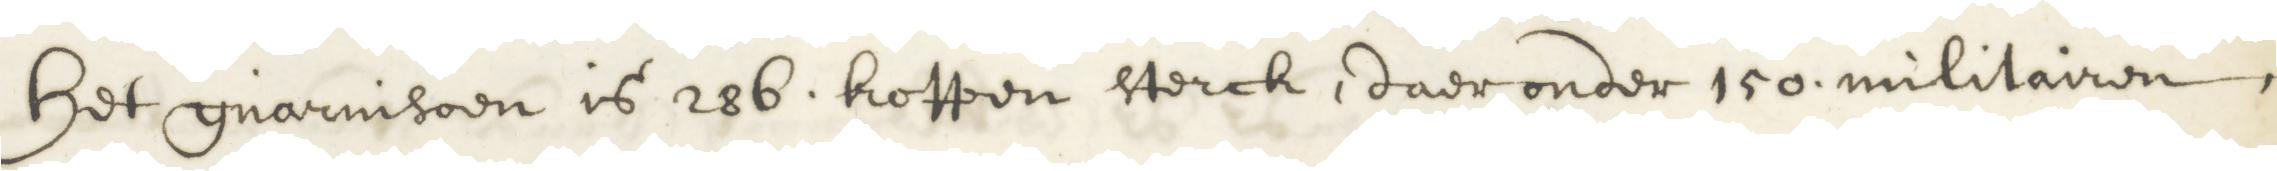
Het guarnisoen is 286. koppen sterck, daer onder 150. militairen,
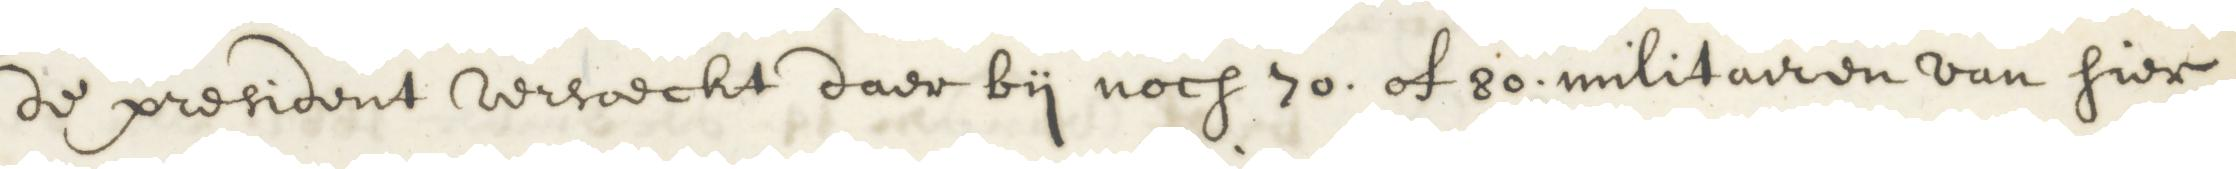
de president versoeckt daer bij noch 70. of 80. militairen van hier
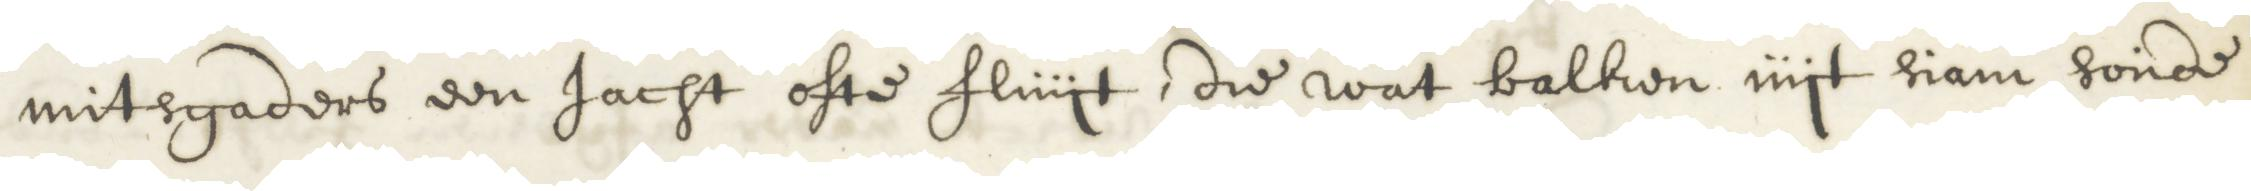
mitsgaders een jacht ofte fluijt, die wat balken uijt siam soude
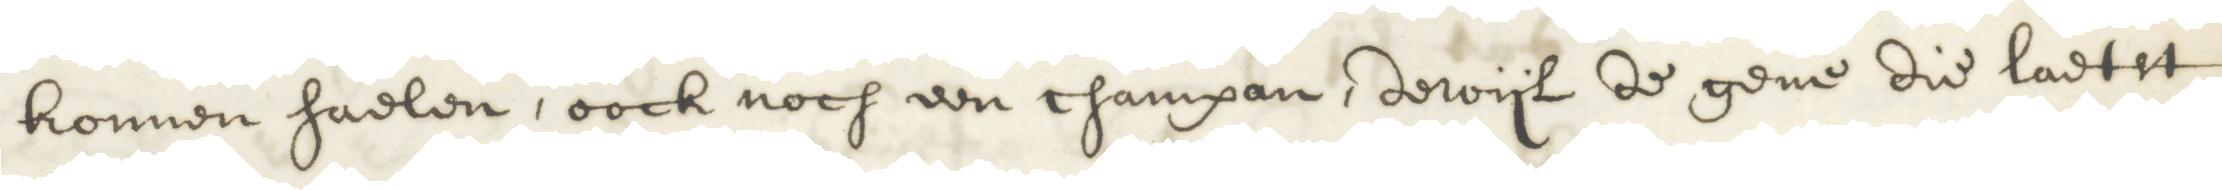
konnen haelen, oock noch een champan, dewijl de gene die laetst
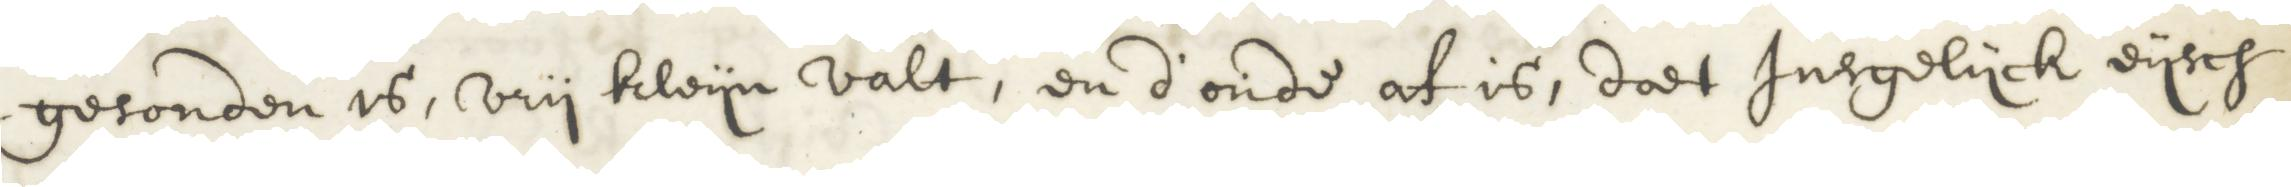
gesonden is, vrij kleijn valt, en d’oude af is, doet jnsgelijck eijsch
